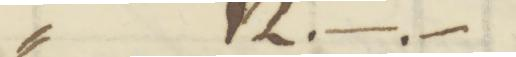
„ 12.—.—
